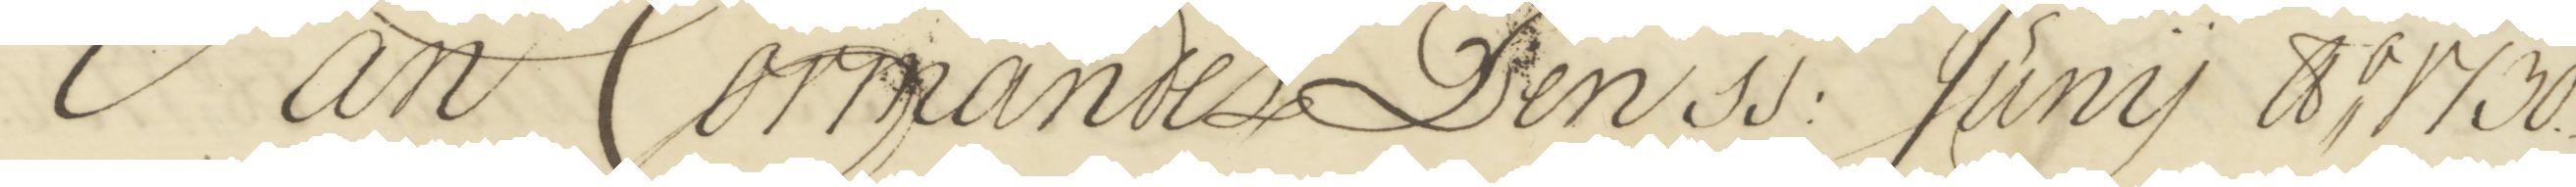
Van Cormandel Den 11:' Junij A„o 1730.
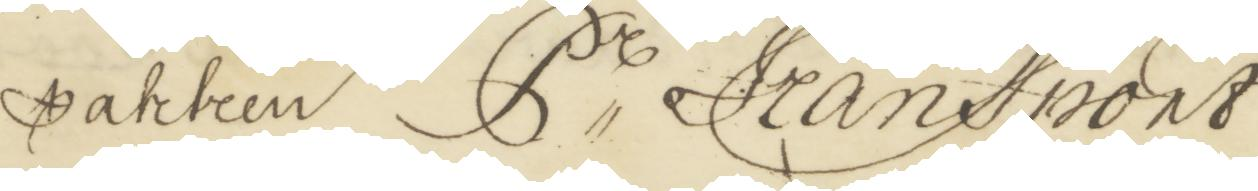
pakken P„r Transport
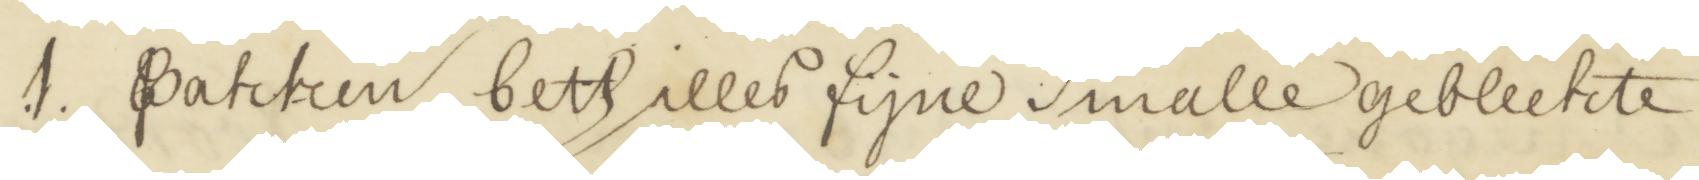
1. pakken bethilles fijne smalle gebleekte
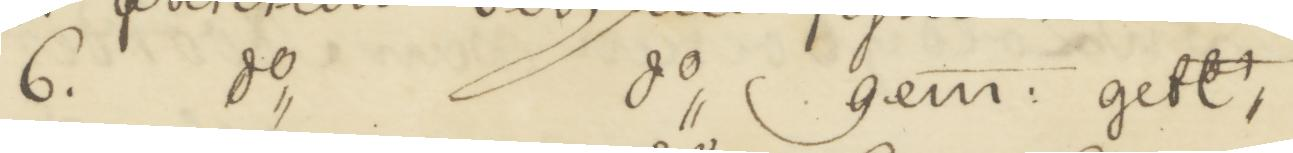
6. d„o d„o gem: gebl„t
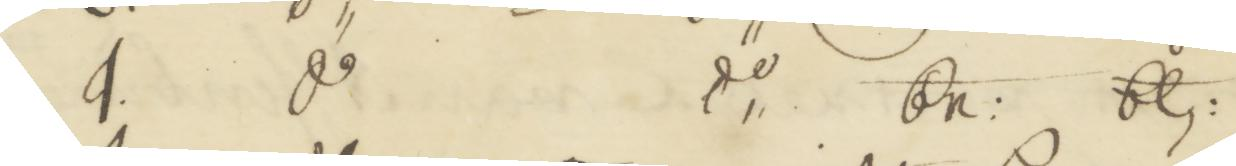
4. do d„o br: bl:
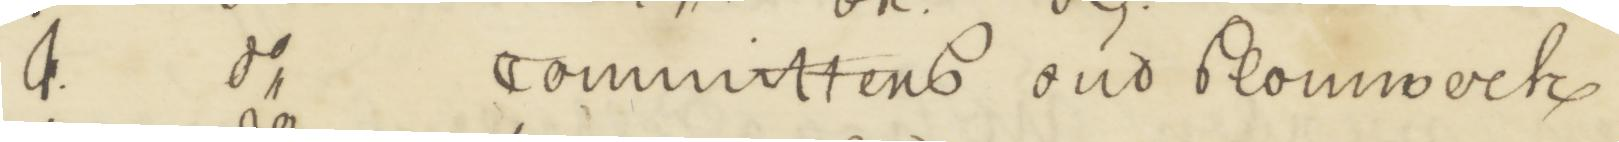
4. d„o committers oud blomwerk
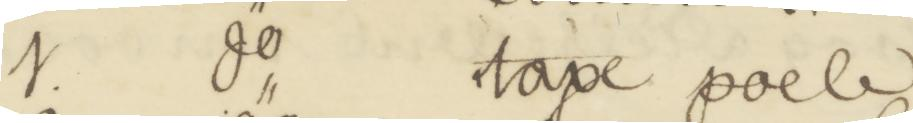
1. d„o tape poele
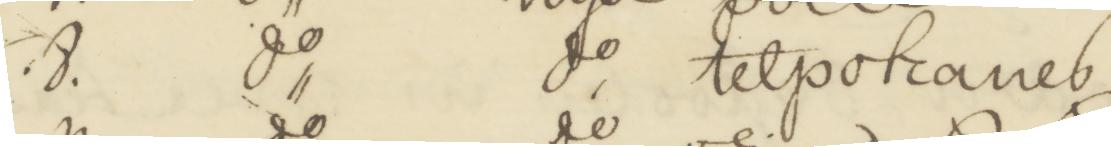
8. d„o d„o telpokanes
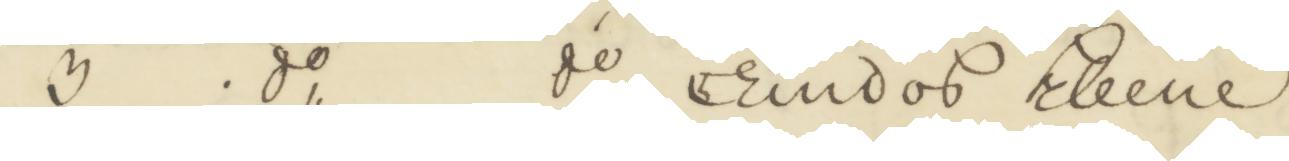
3 d„o d„o chindos kleene
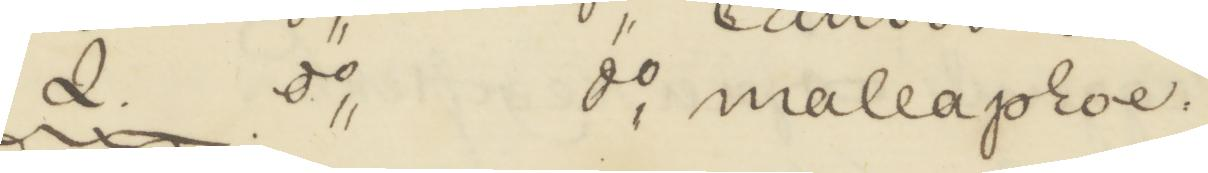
2. d„o d„o mallaphoe:
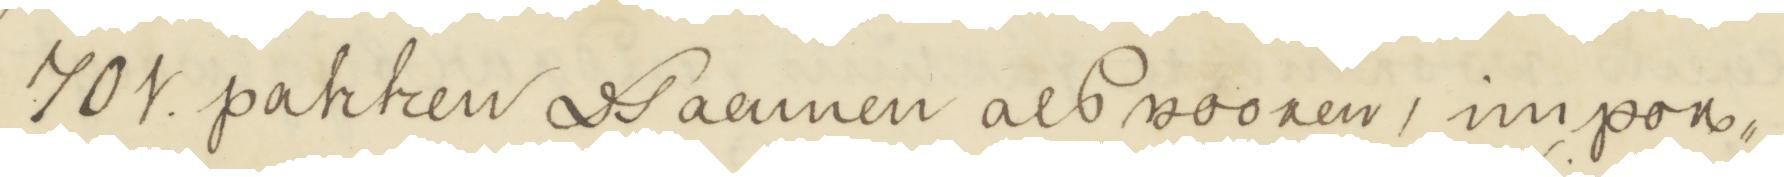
701. pakken tesaamen als vooren, impor„
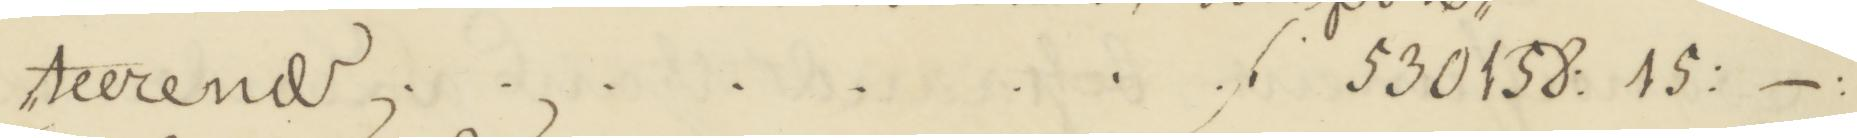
„teerende . . . . . . . . ƒ 530158: 15: — :
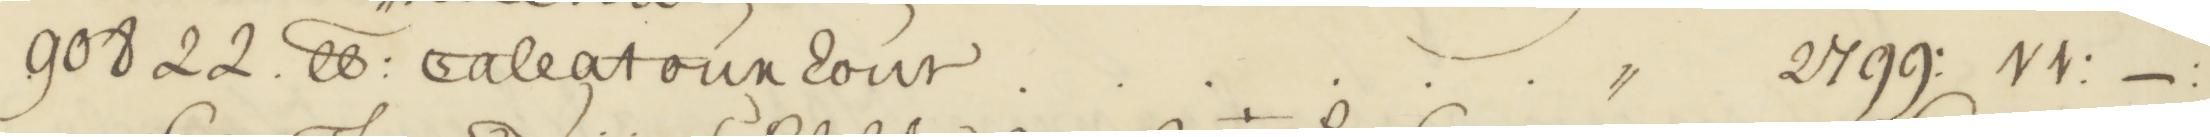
90822. lb: caleatour hout . . . . . . „ 2799: 11: — :
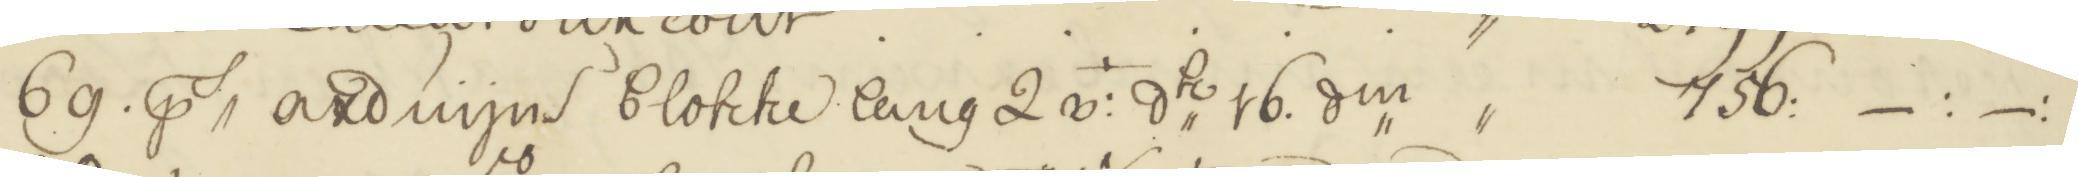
69. p„s arduijne blokke lang 2 v:t d„k 16. d„m 756: — : —:
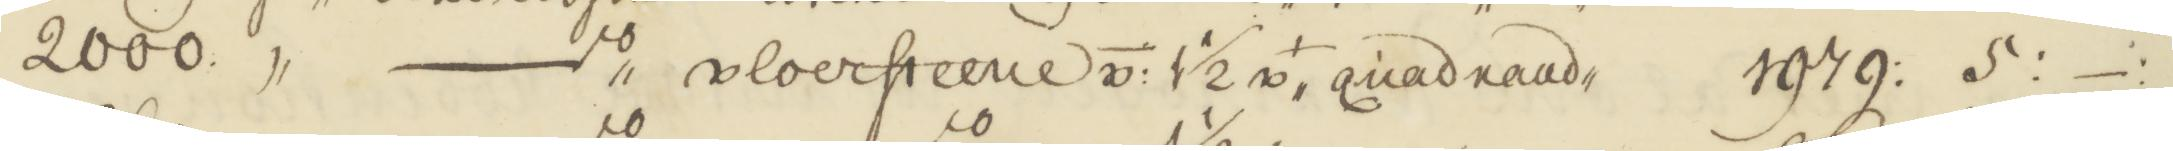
2000. „ _„o vloersteene v: 1½ v„t quadraad„ 1979: 5: —:
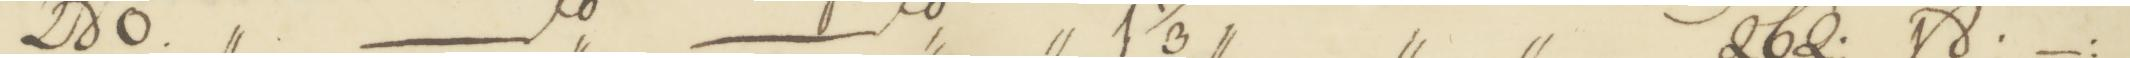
280. „ _o _„o „ 1 1/3 „ „ „ 262: 18: —:
